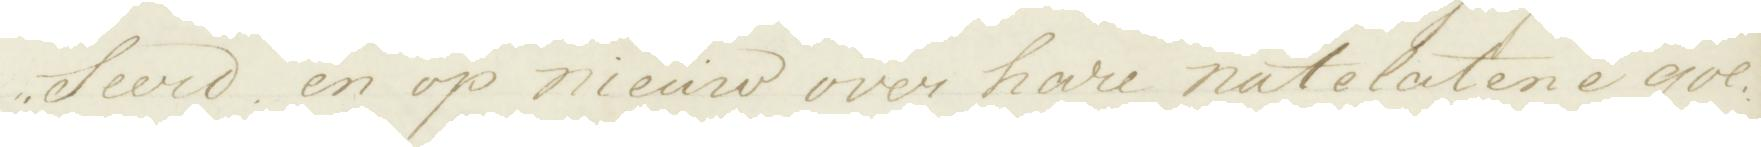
„seerd, en op nieuw over hare natelatene goe„
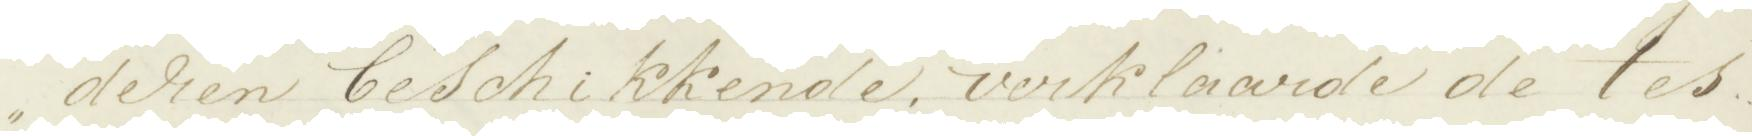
„deren beschikkende, verklaarde de tes„
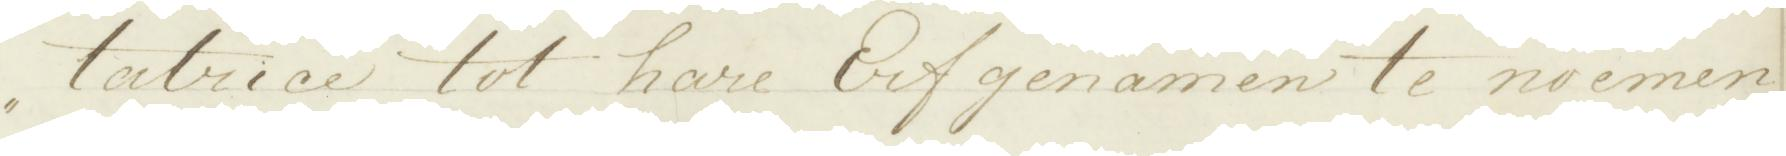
„tatrice tot hare Erfgenamen te noemen
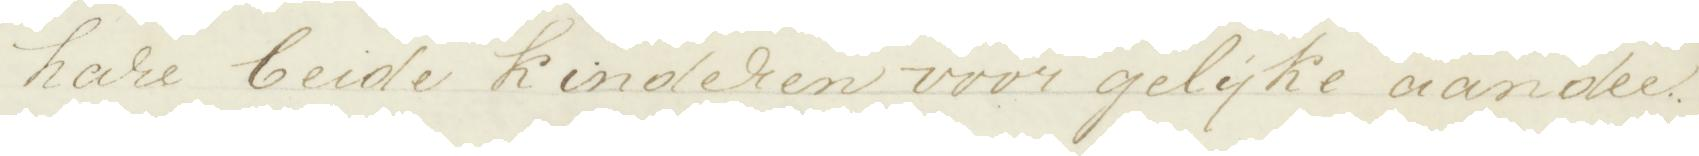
hare beide kinderen voor gelijke aan dee„
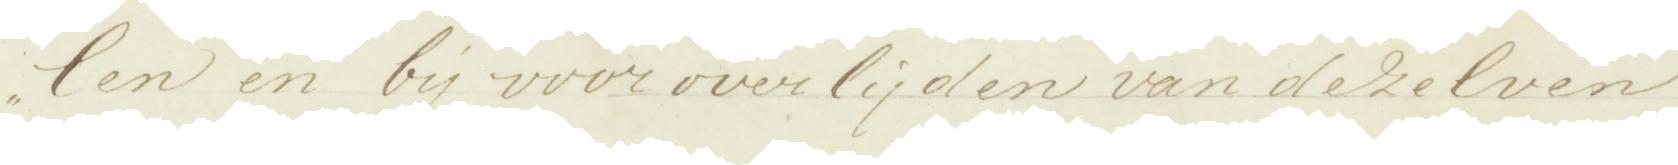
„len en bij voor over lijden van dezelven
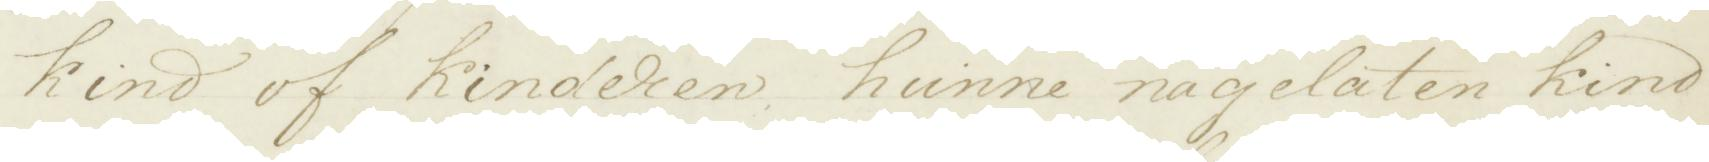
kind of kinderen, hunne nagelaten kind
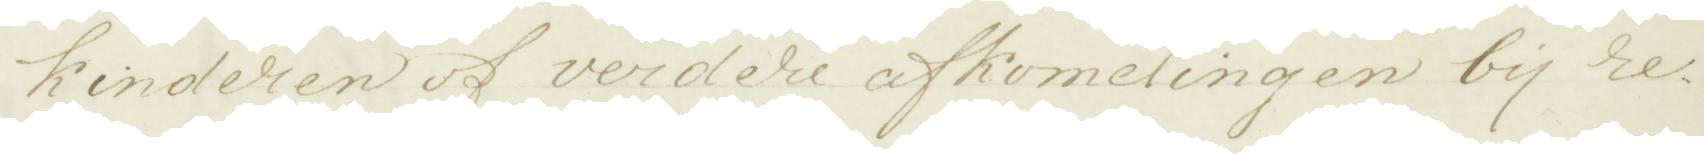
kinderen of verdere afkomelingen bij re„
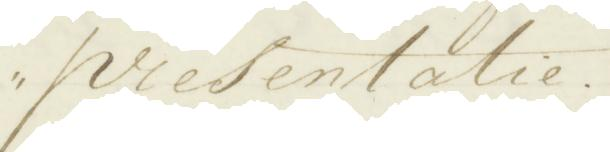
„presentatie.
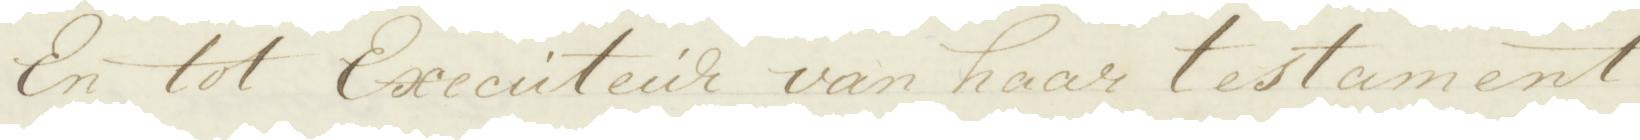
En tot Executeur van haar testament
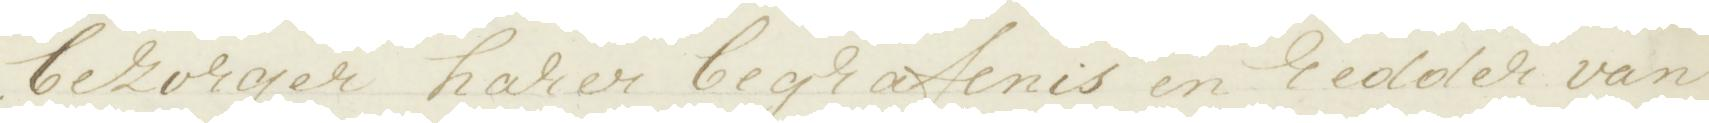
bezorger harer begrafenis en redder van
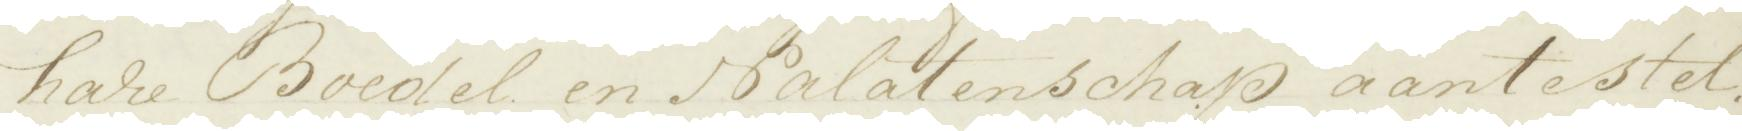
hare Boedel en Nalatenschap aan te stel„
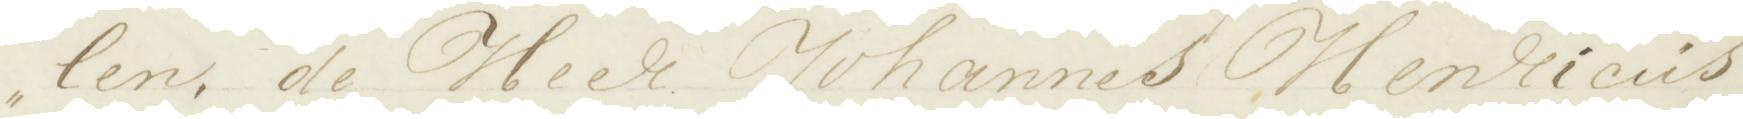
„len, de Heer Johannes Henricus
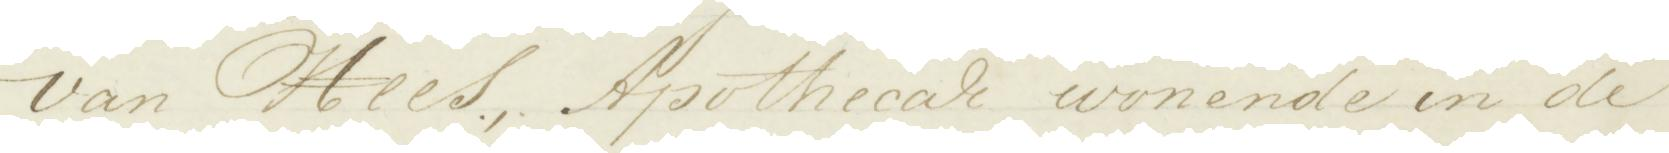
van Hees, Apothecar wonende in de
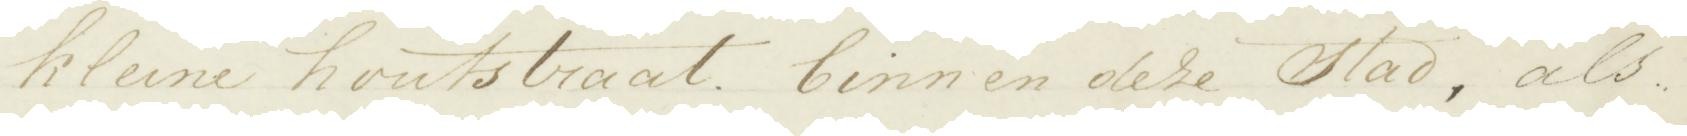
kleine houtstraat, binnen deze Stad, als„
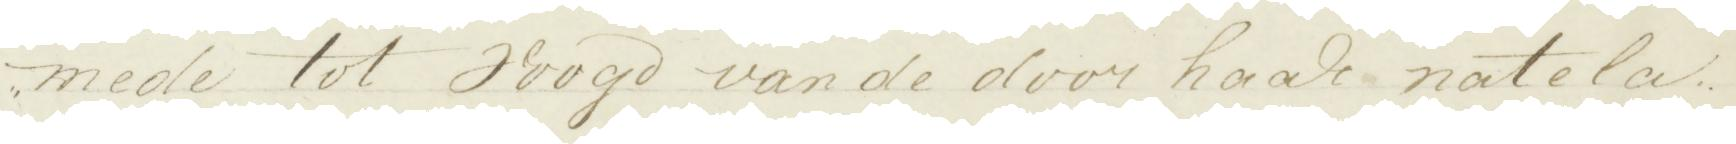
„mede tot Voogd van de door haar natela„
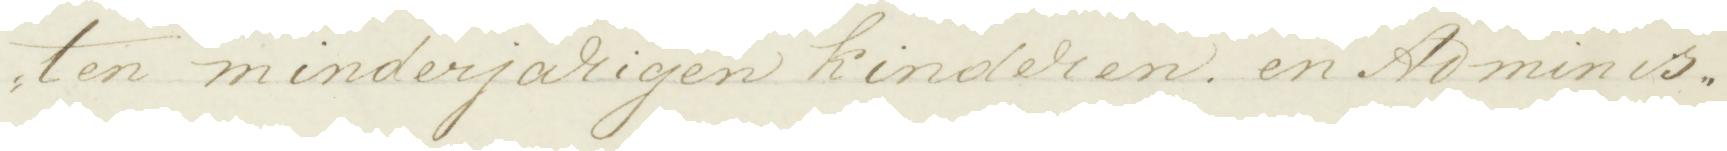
„ten minderjarigen kinderen, en Adminis„
